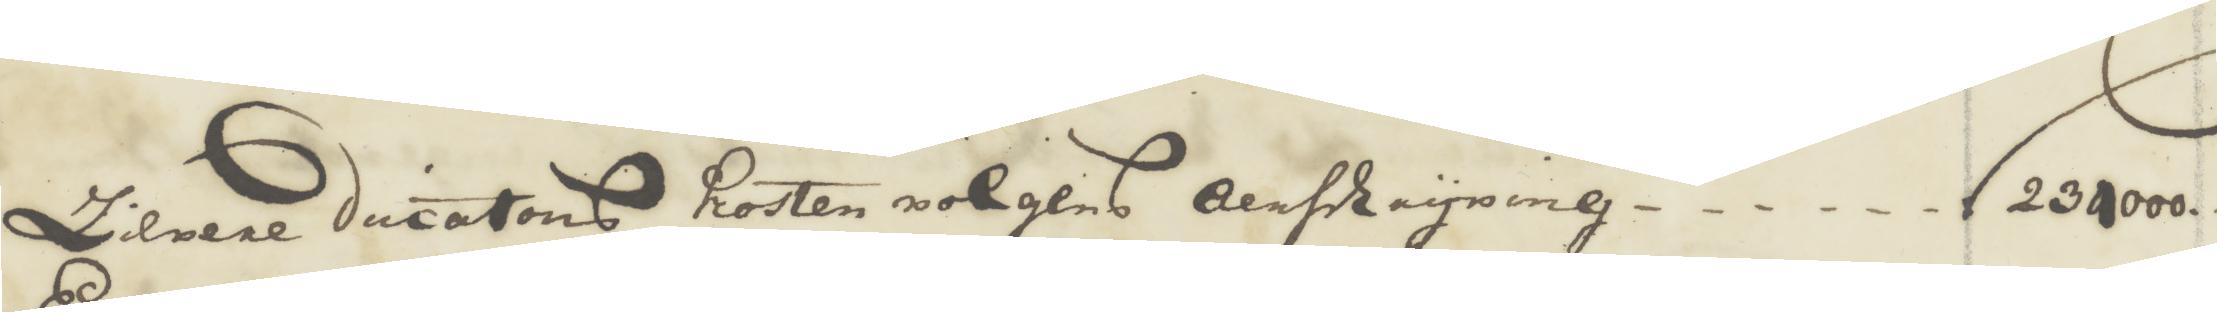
zilvere ducatens kosten volgens aenschrijving - - - - - - ƒ 2340.
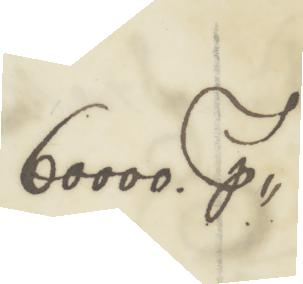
60000. p„s
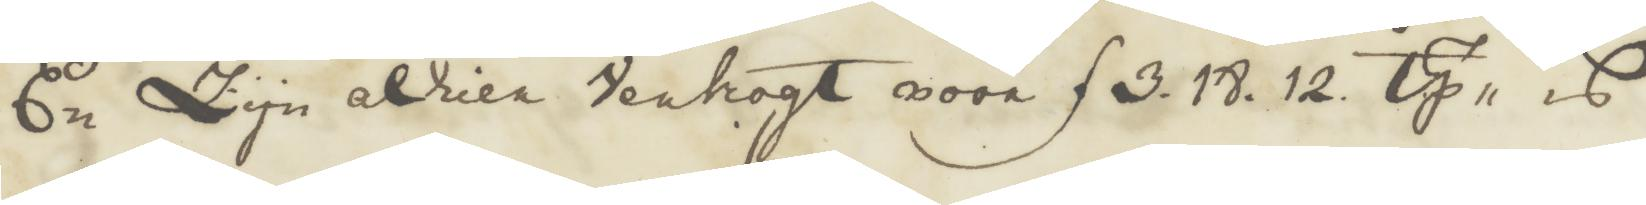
En zijn alhier verkogt voor ƒ3. 18. 12. tp„s is
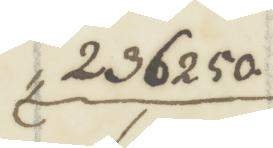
„ 236250
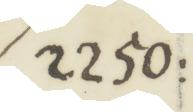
2250:
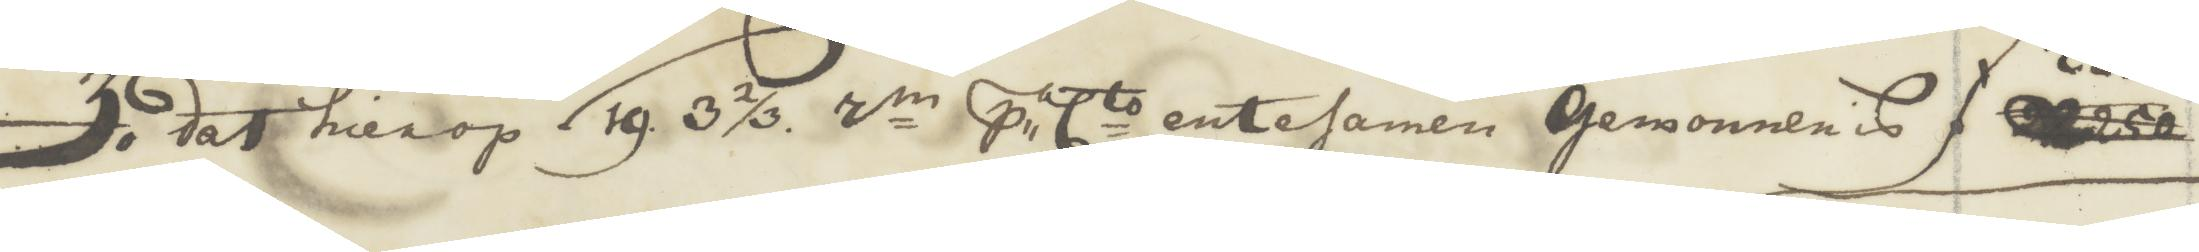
Zo dat hier op ƒ19. 3 2/3. r=m p„rC=to en tesamen gewonnen is ƒ 22250
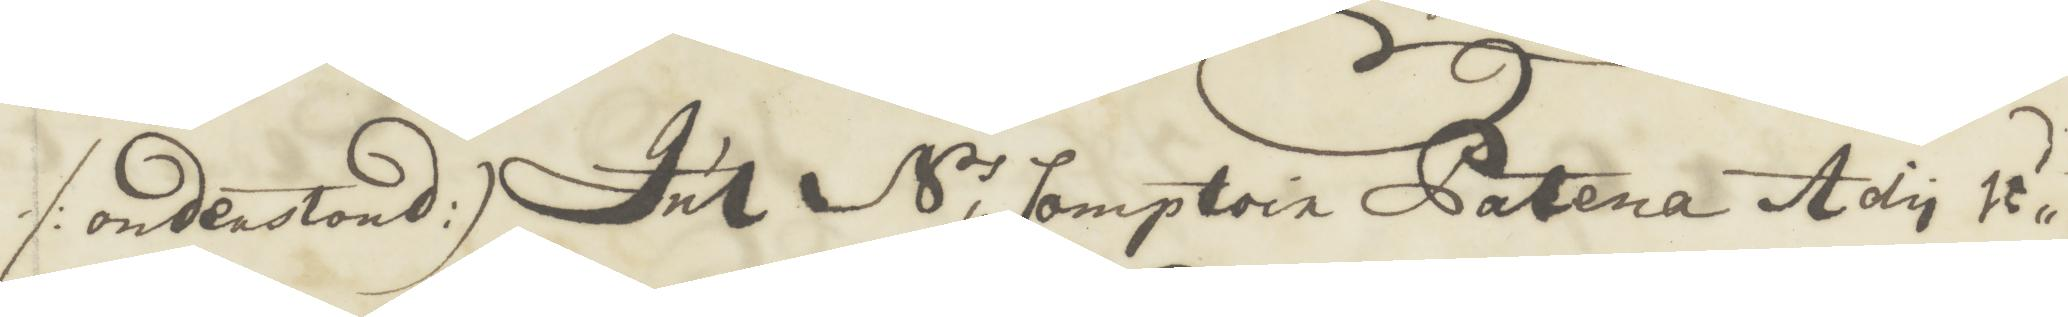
/: onderstond :/ In't N„s Comptoir Patena Adij 15„' xber: 1747.
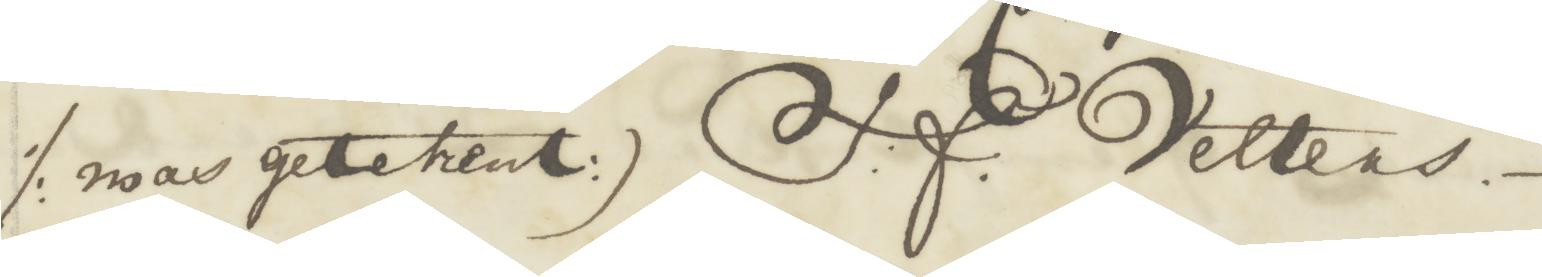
/: was getekent :) S: f: Velters.
